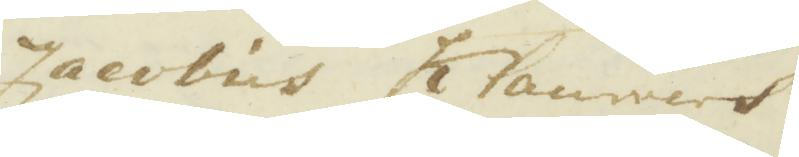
Jacobus Klauwers
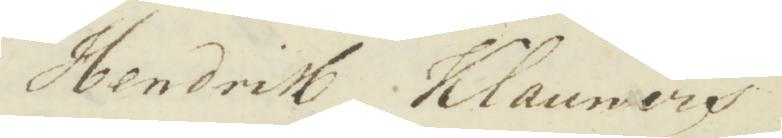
Hendrik Klauwers
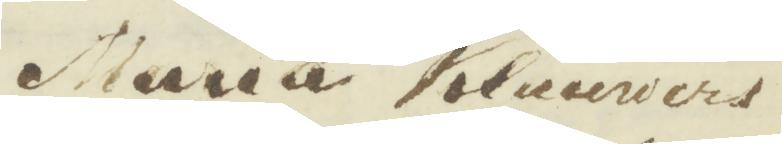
Maria Klauwers
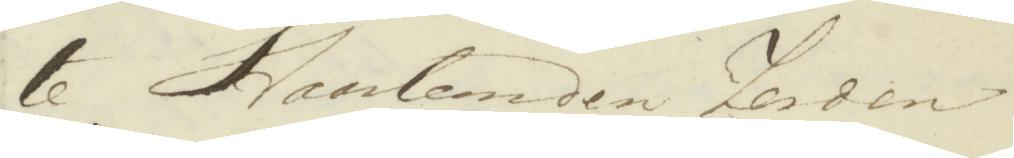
te Haarlem den Zesden
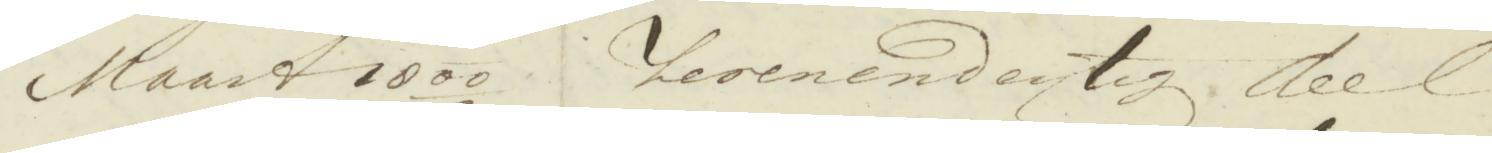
Maart 1800 Zevenendertig deel
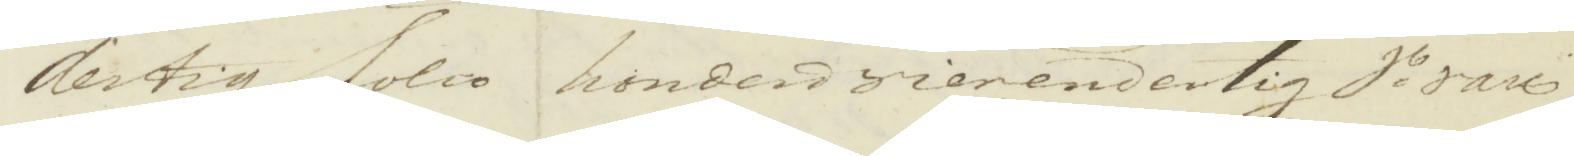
dertig folio honderd vierendertig V.o vak
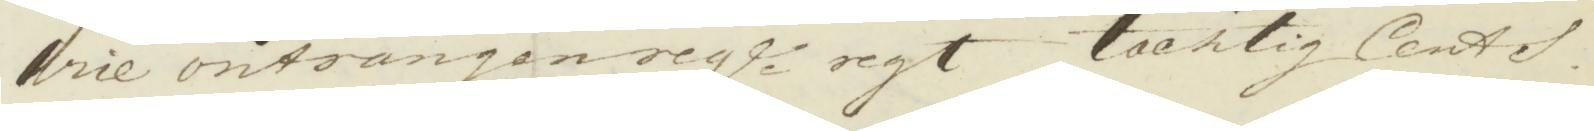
drie ontvangen reg=e regt tachtig Cents
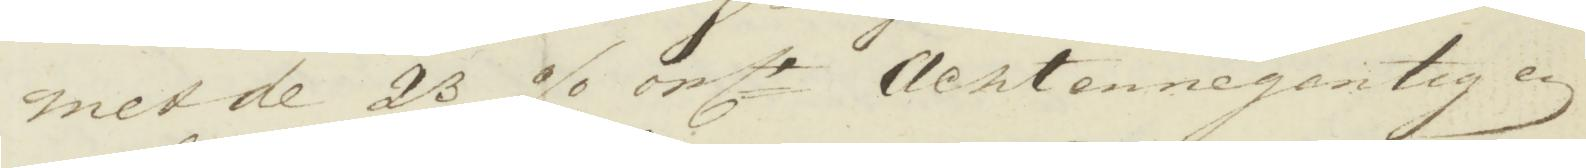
met de 23 % opC=t Achtennegentig en
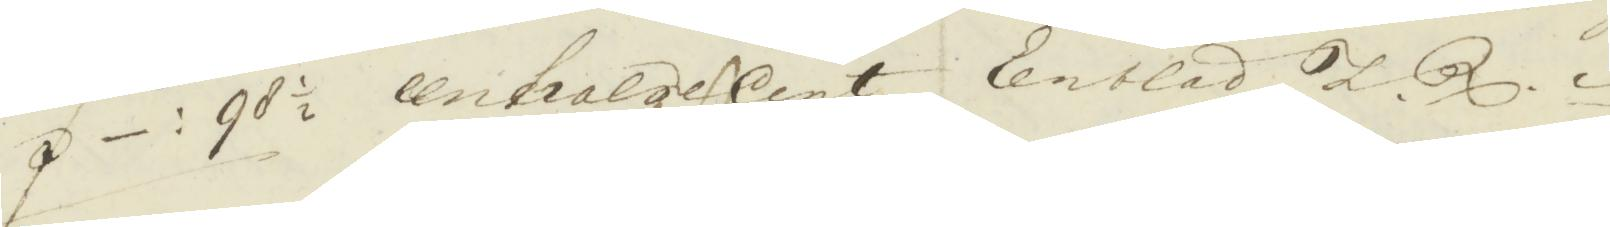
ƒ —: 98½ een halve Cent Een blad Z.R.
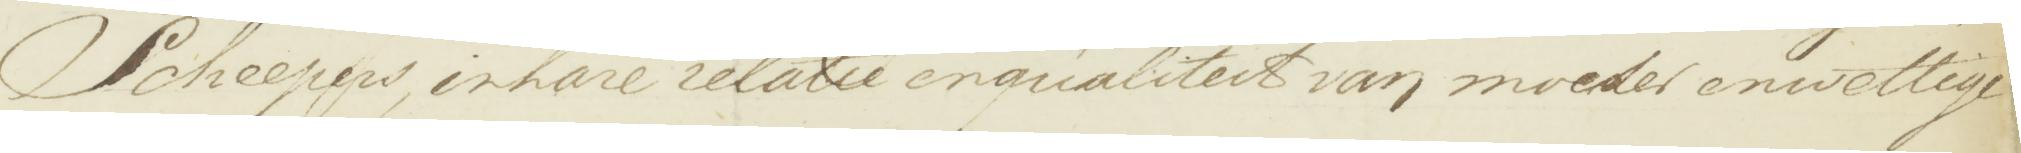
Scheepers, in hare relatie en qualiteit van moeder en wettige
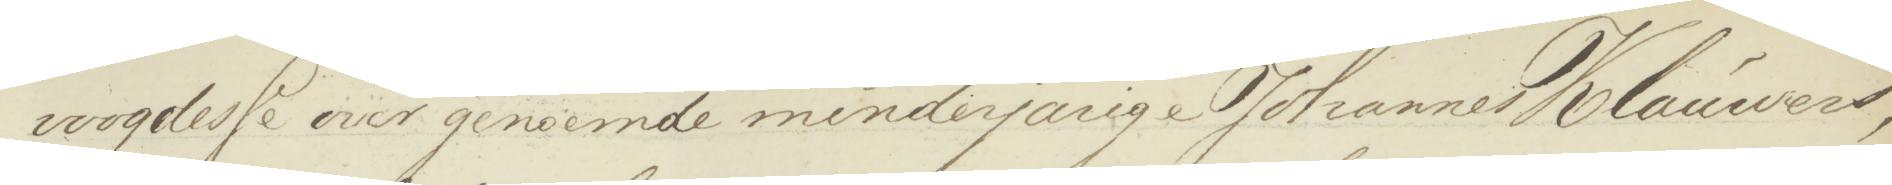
voogdesse over genoemde minderjarige Johannes Klauwers,
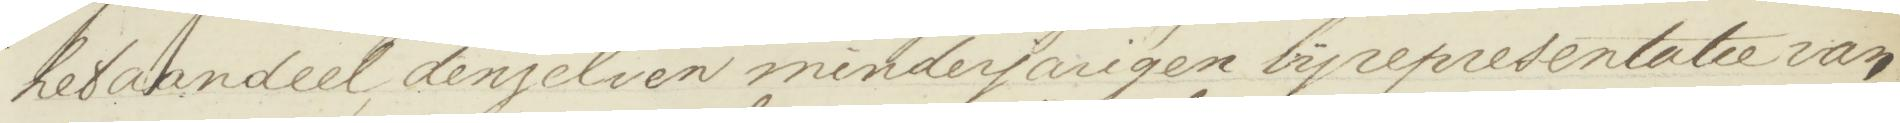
het aandeel, denzelven minderjarigen bij representatie van
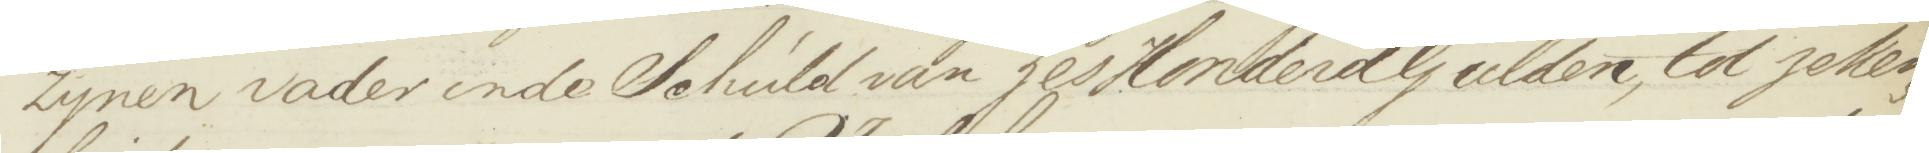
zynen vader in de Schuld van Zes Honderd Gulden, tot zeker„
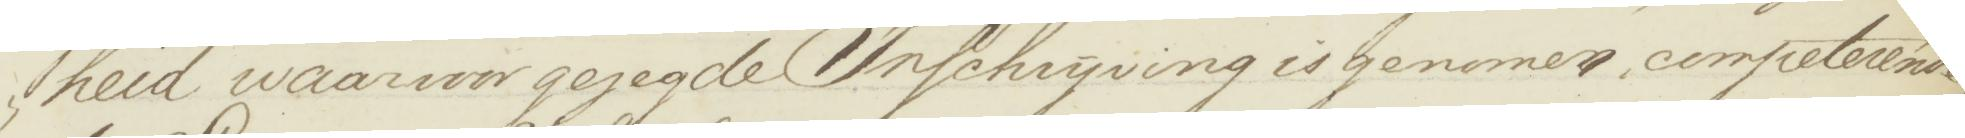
„heid waarvoor gezegde Inschrijving is genomen, competerende
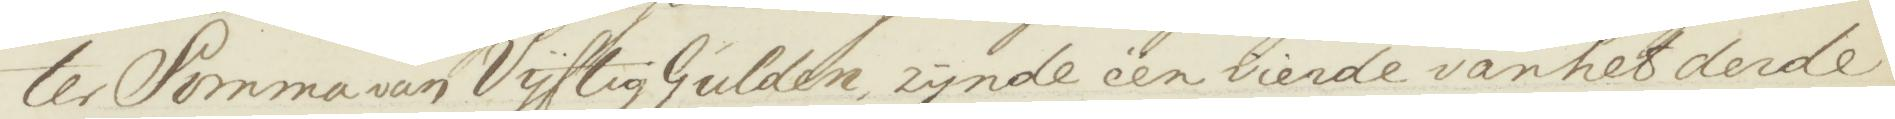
ter Somma van Vijftig Gulden, zijnde een vierde van het derde
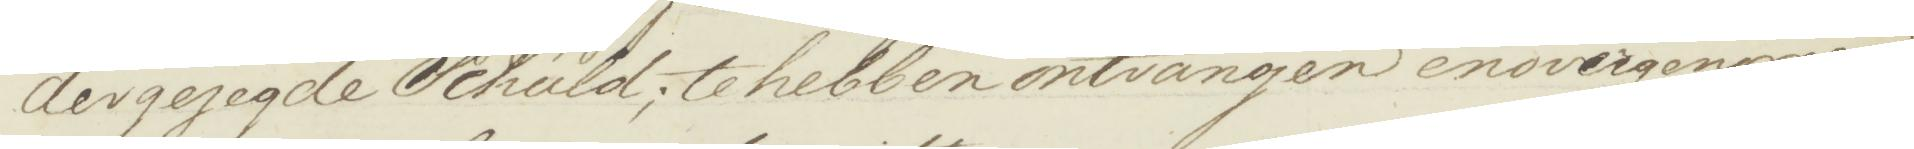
der gezegde Schuld, te hebben ontvangen en overgenomen
